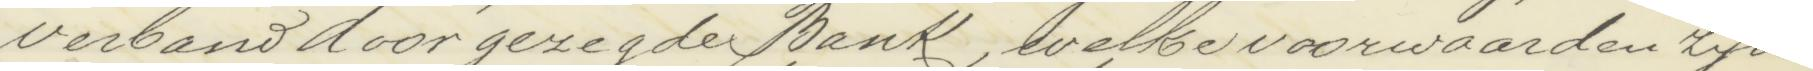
verband door gezegde Bank, welke voorwaarden zijn
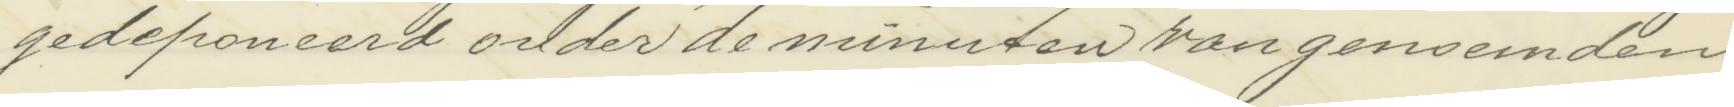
gedeponeerd onder de minuten van genoemden
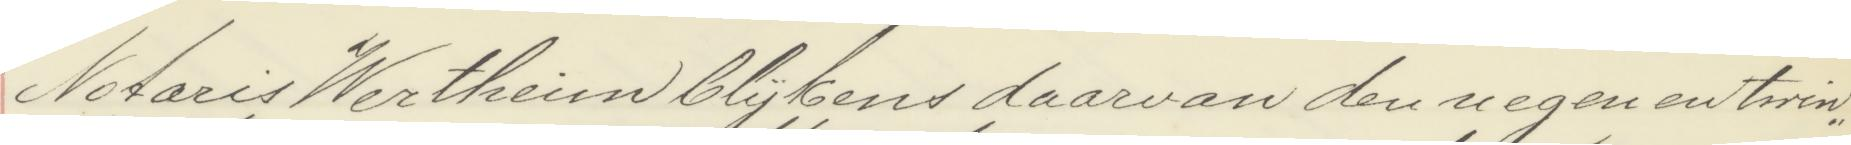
Notaris Werthein blijkens daarvan den negen en twin„
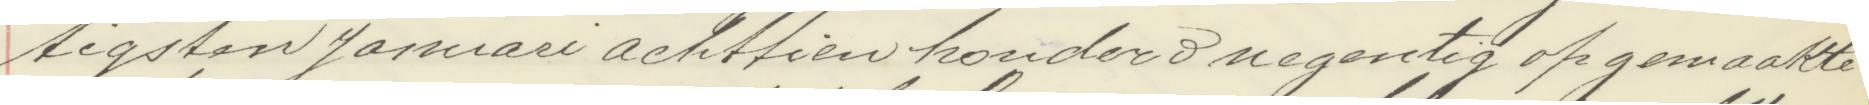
tigsten Januari achttien honderd negentig opgemaakte
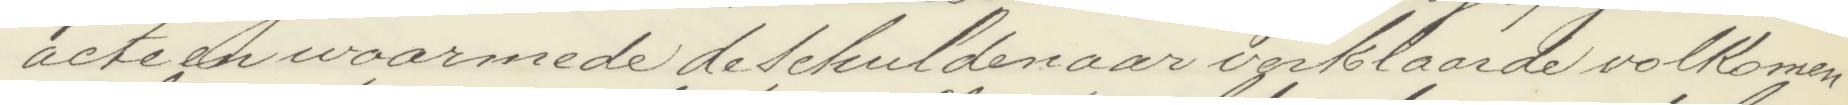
acte en waarmede de schuldenaar verklaarde volkomen
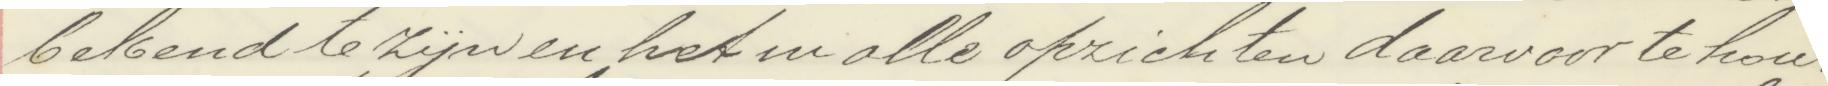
bekend te zijn en het in alle opzichten daarvoor te hou
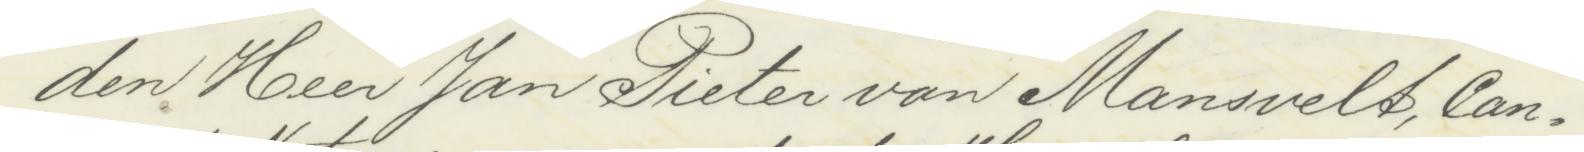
den Heer Jan Pieter van Mansvelt, Can=
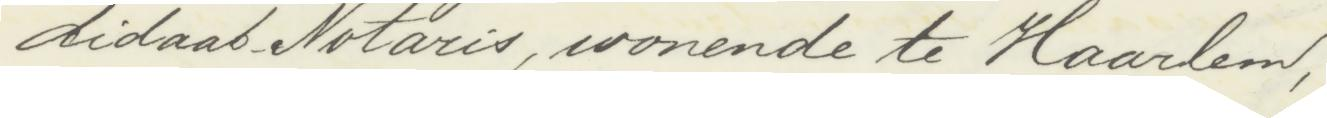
didaat Notaris, wonende te Haarlem,
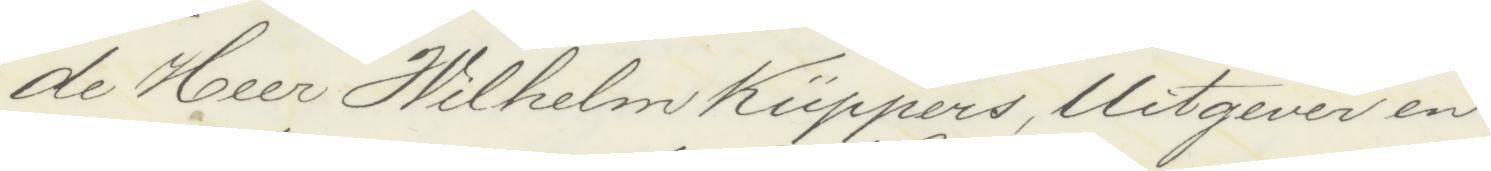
de Heer Wilhelm Küppers, Uitgever en
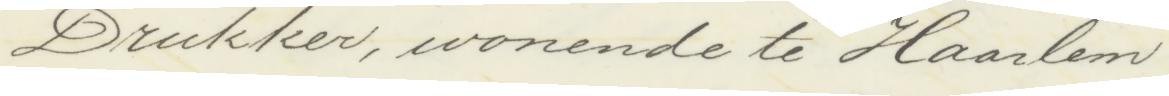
Drukker, wonende te Haarlem
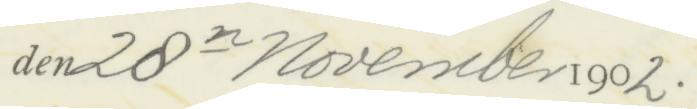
den 28=n November1902.
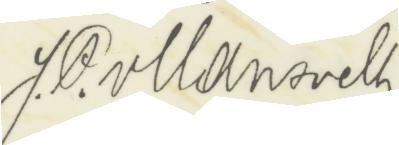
J.D.vMansvelt
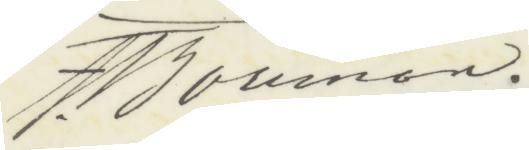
F.Bouman.
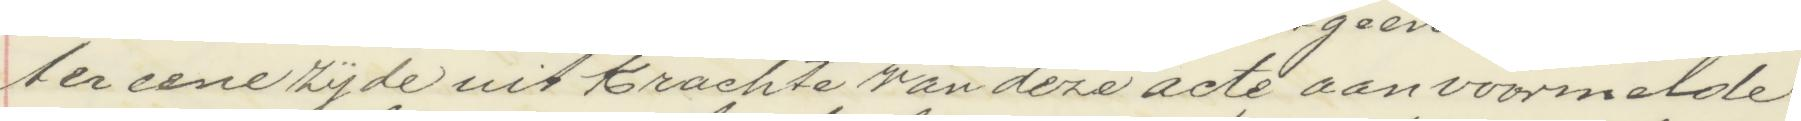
ter eene zijde uit krachte van deze acte aan voormelde
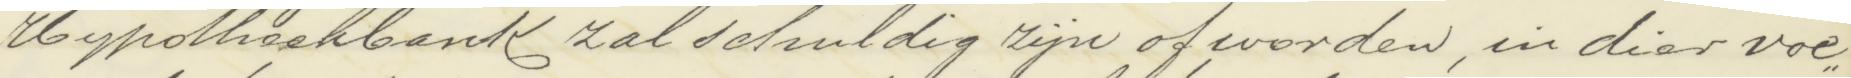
Hypotheekbank zal schuldig zijn of worden, in dier voe„
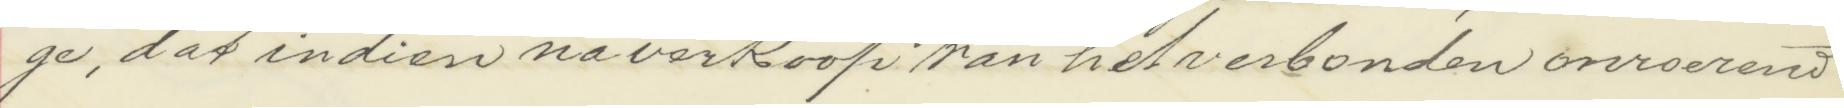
ge, dat indien na verkoop van het verbonden onroerend
